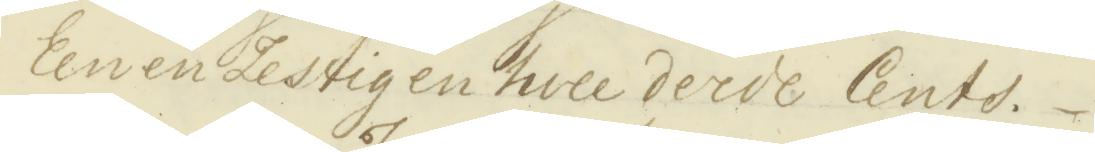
Een en Zestig en twee derde Cents.
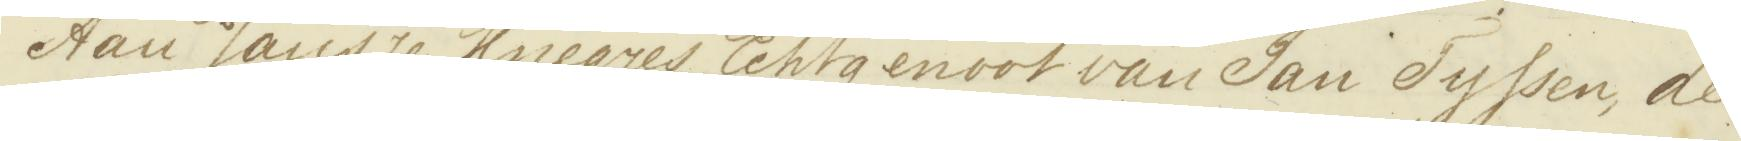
Aan Jansje Knegjes Echtgenoot van Ian Tijssen, de
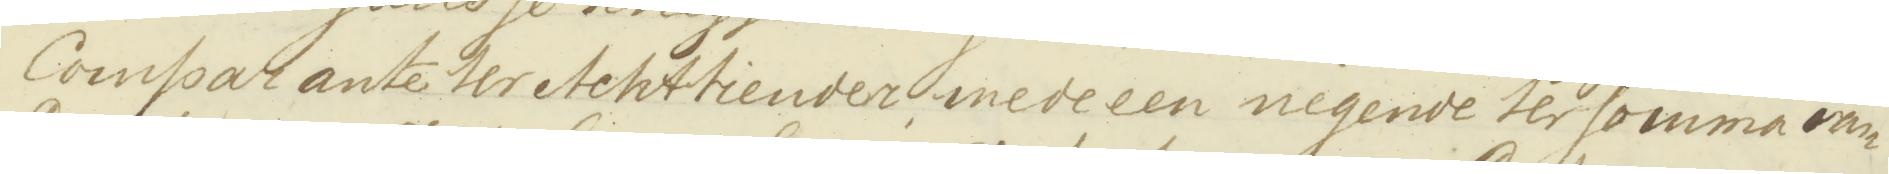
Comparante ter Achttiender mede een negende ter somma van
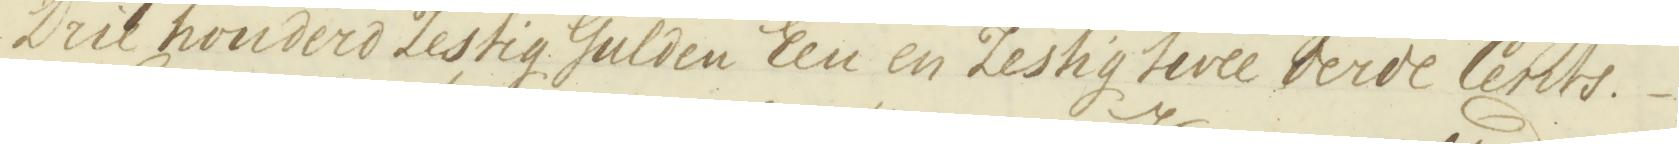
Drie honderd Zestig Gulden Een en Zestig twee derde Cents.-
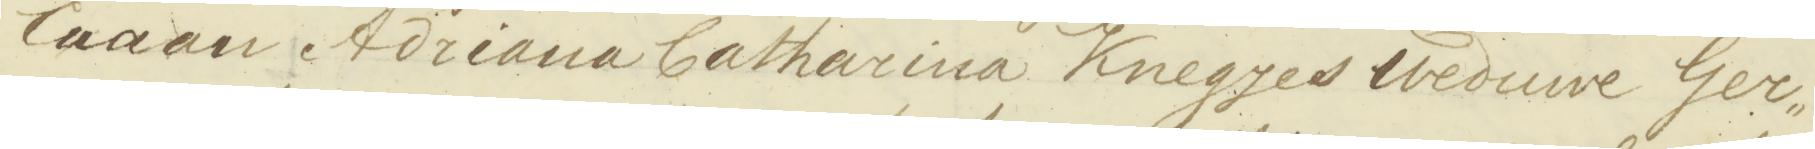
En aan Adriana Catharina Knegjes weduwe Ger„
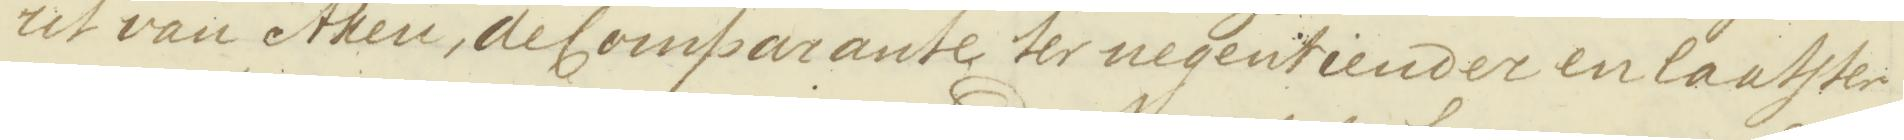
rit van Aken, de Comparante ter negentiender en laatster
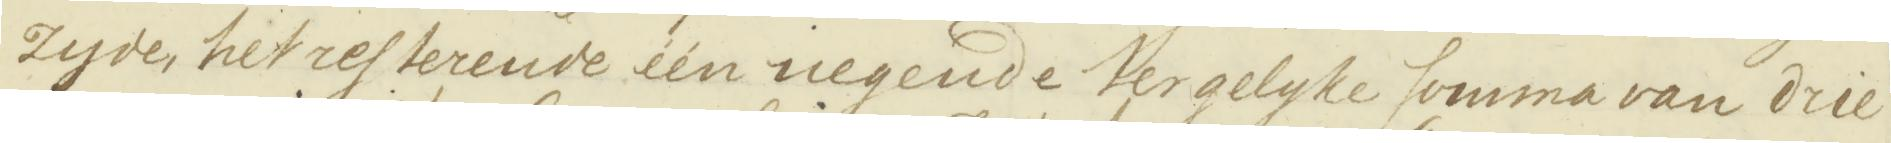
zyde, het resterende één negende ter gelyke somma van drie
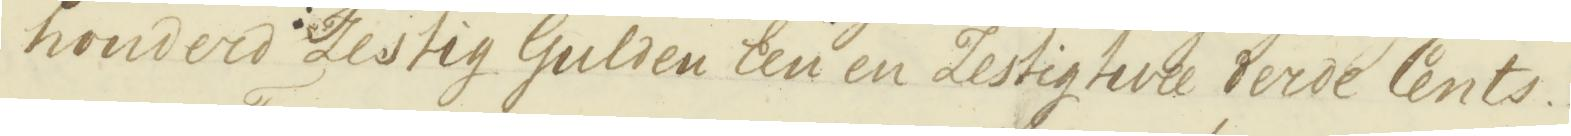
honderd Zestig Gulden Een en Zestig twee derde Cents.
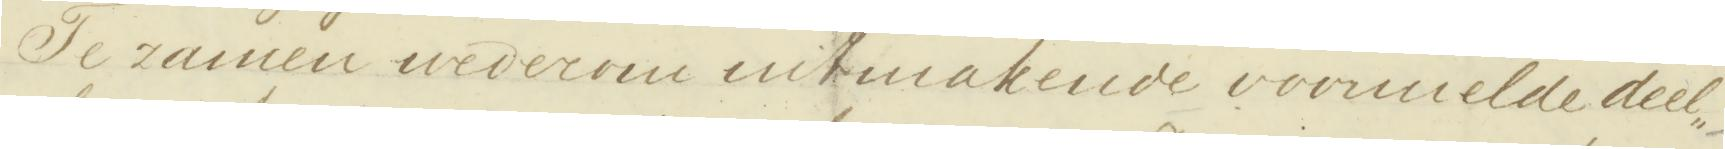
Te zamen wederom uitmakende voormelde deel„
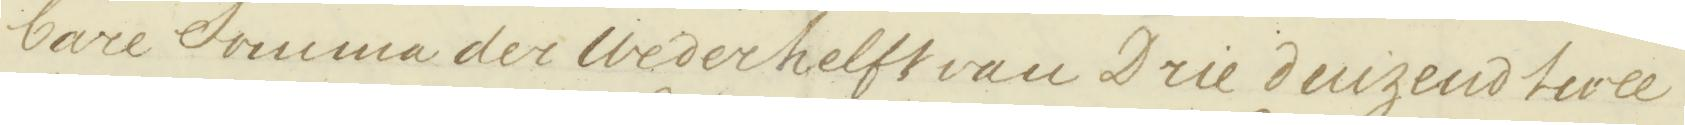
bare Somma der Wederhelft van Drie duizend twee
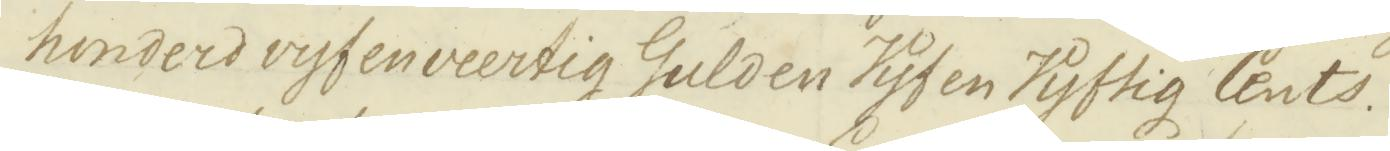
honderd vyf en veertig Gulden Vyf en Vyftig Cents.
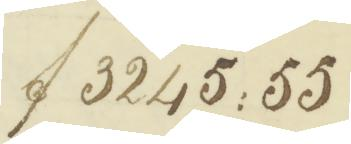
ƒ 3245:55
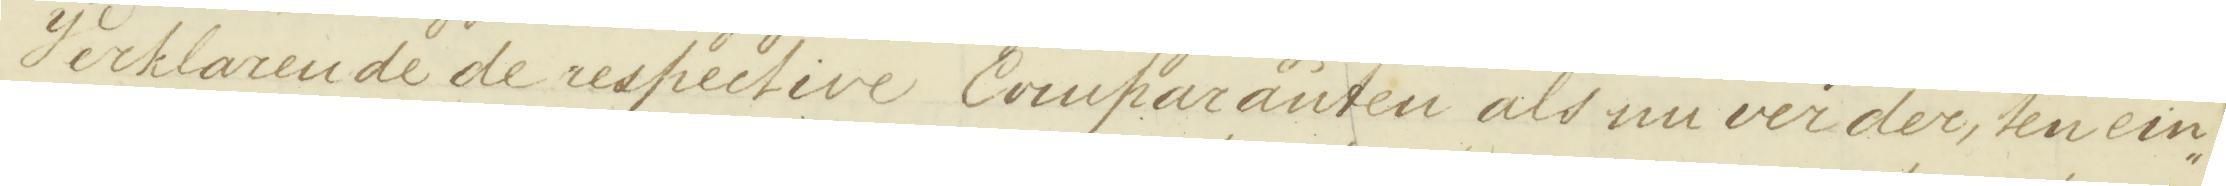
Verklarende de respective comparanten als nu verder, ten ein„
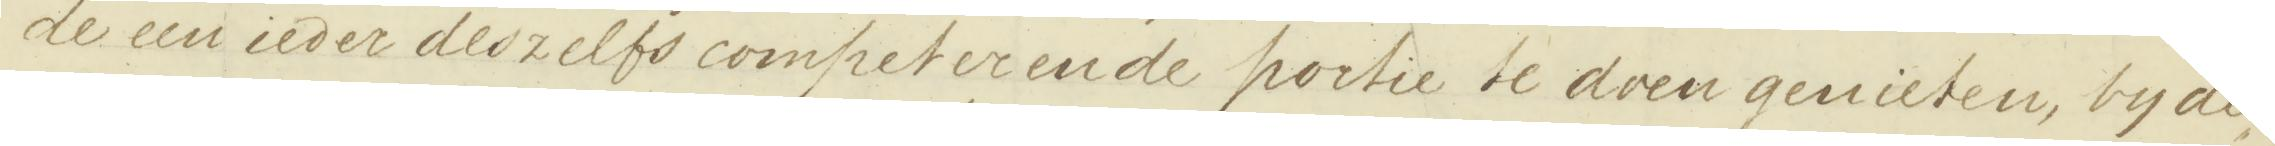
de een ieder deszelfs competerende portie te doen genieten, bij de„
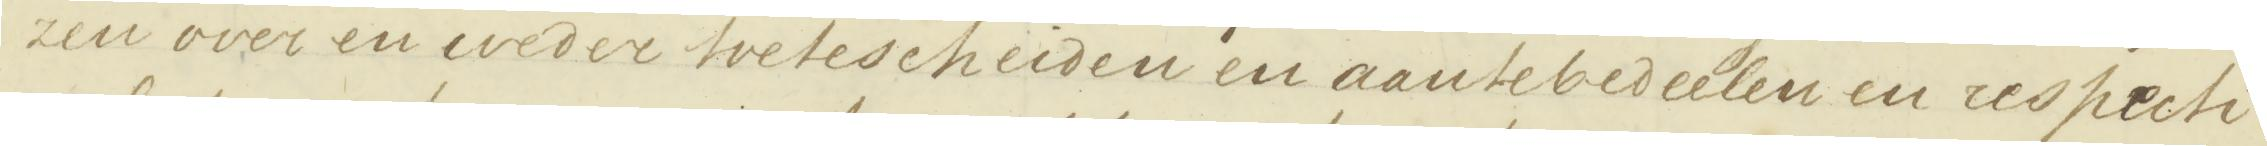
zen over en weder toe tescheiden en aan te bedeelen en respecti
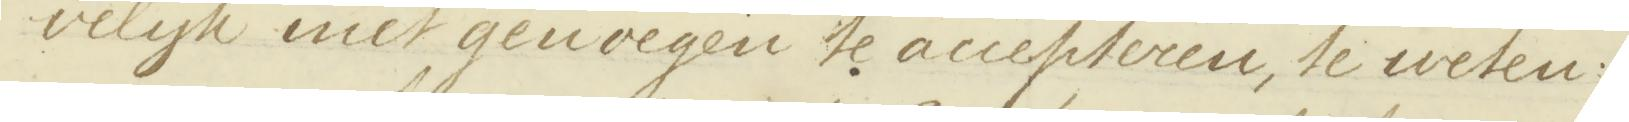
velyk met genoegen te accepteren, te weten:
